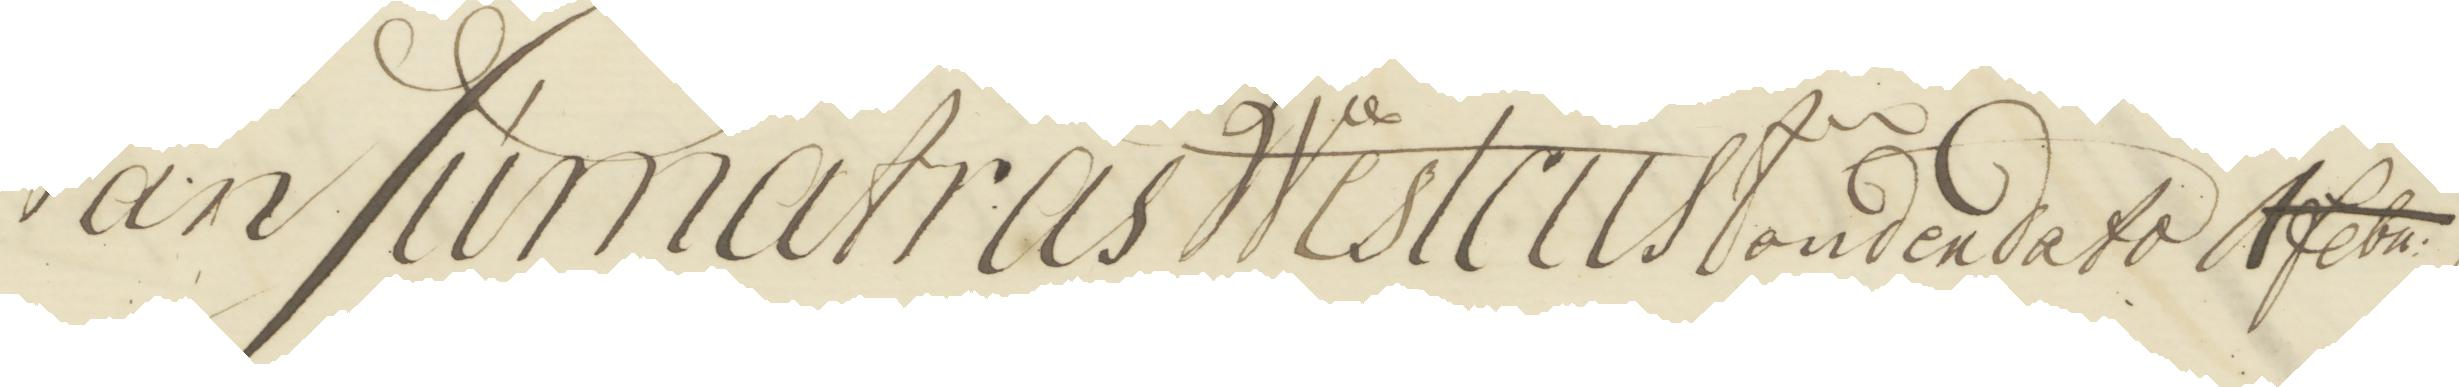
Van Sumatras westcust onder dato 4 febr:
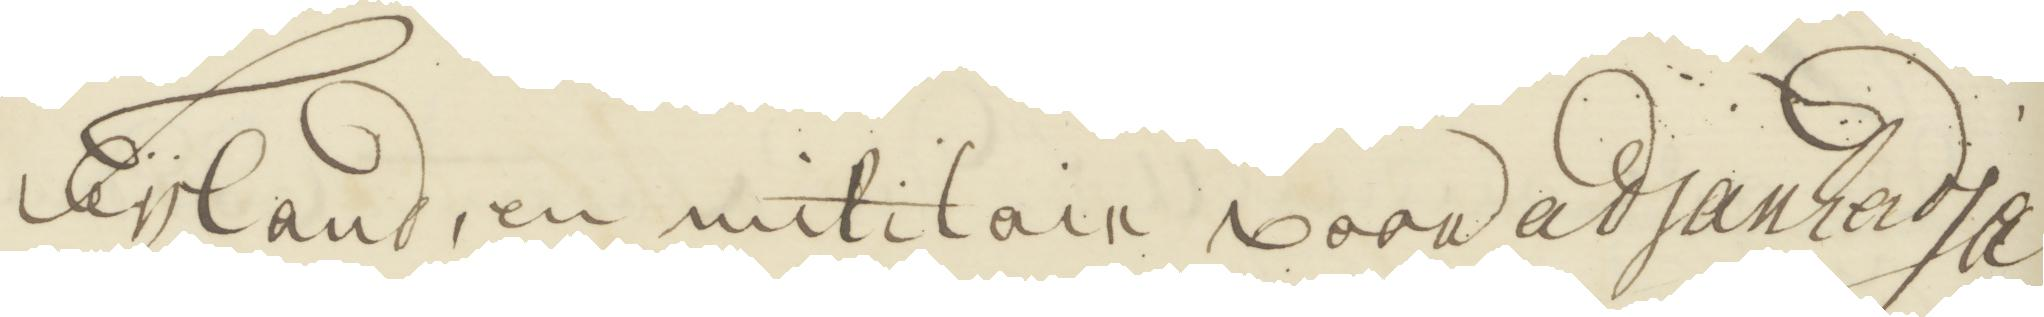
Eijland, en militair voor adjarhadja
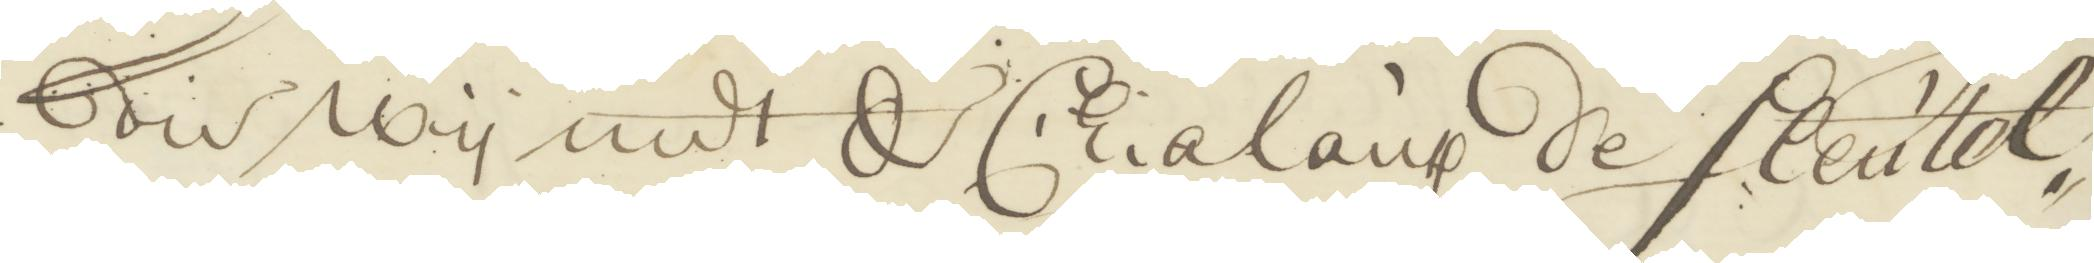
die wij met de Chialoup de Sleutel„
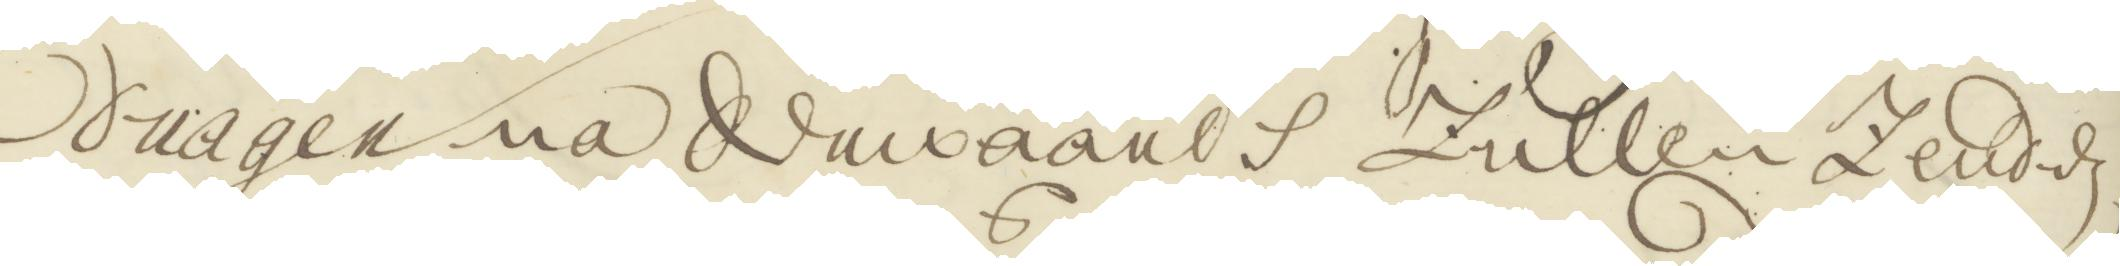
drager na derwaards Zullen Zenden
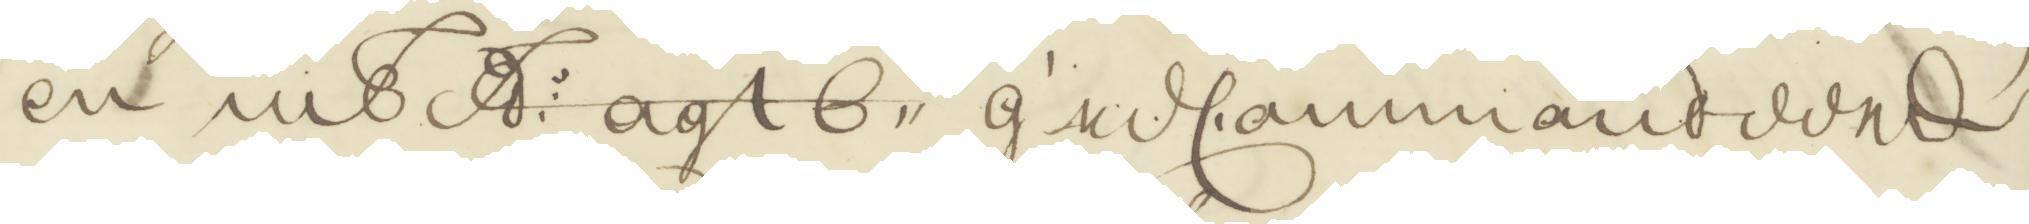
en uE Ed:' agtb„s g’recommandeerde
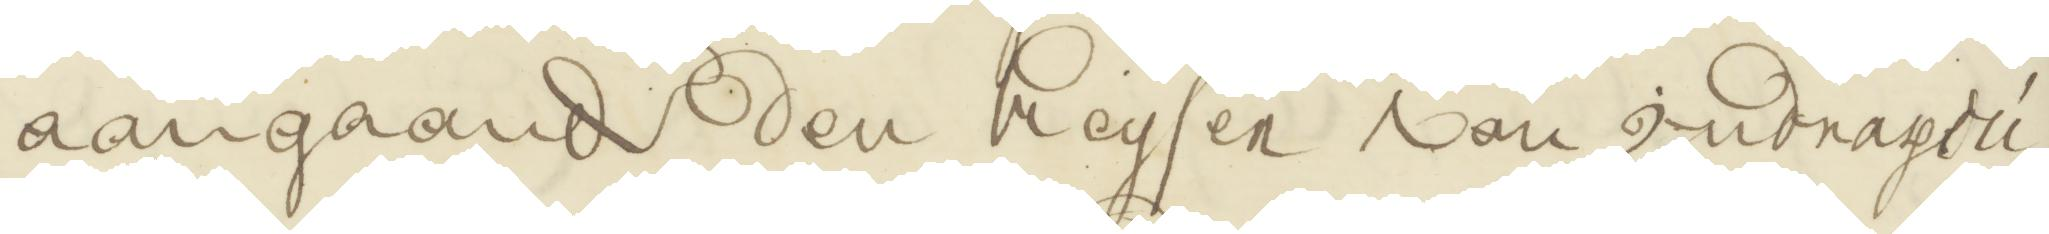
aan gaande den keijser van Jndrapou
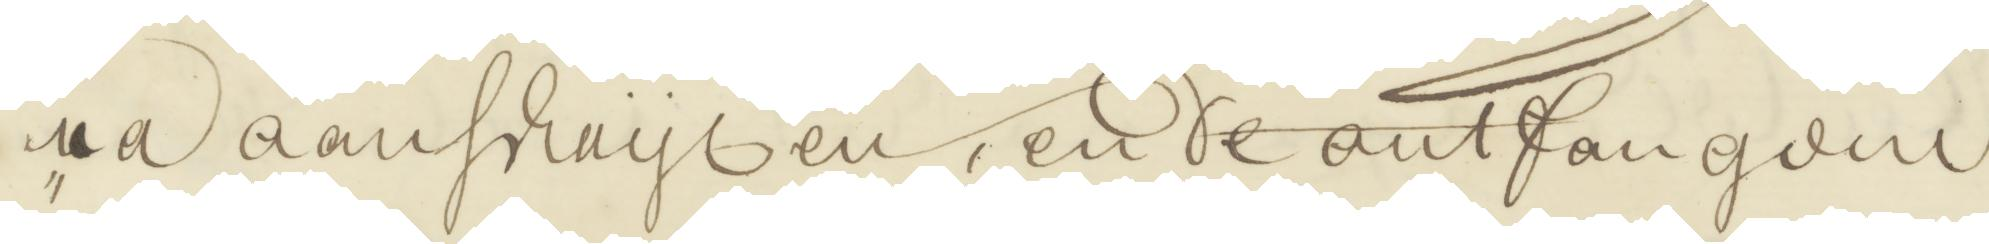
„ra aanschrijven, en de ontfangene
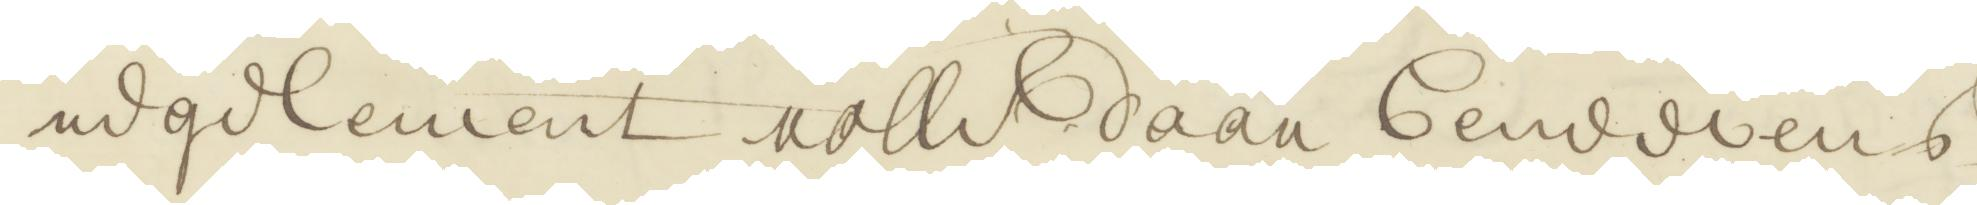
regelement rolle daar beneevens
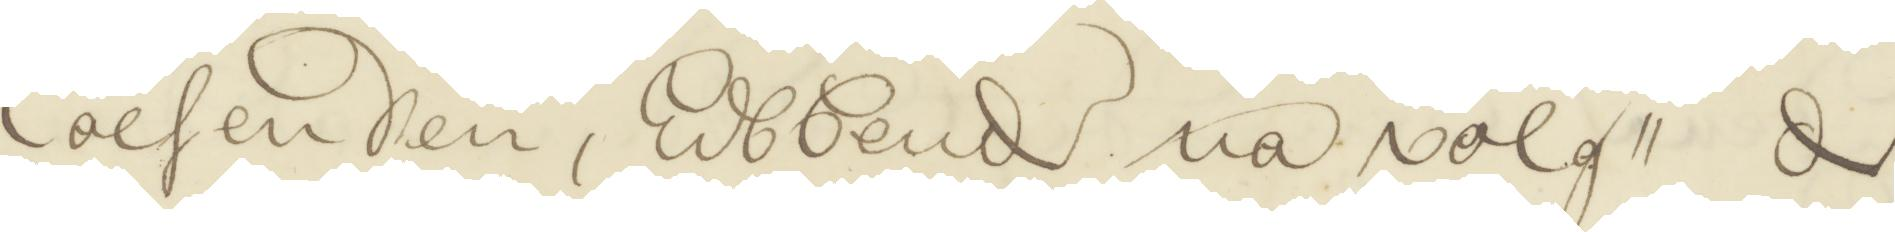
toesenden, hebbende na volg„s de
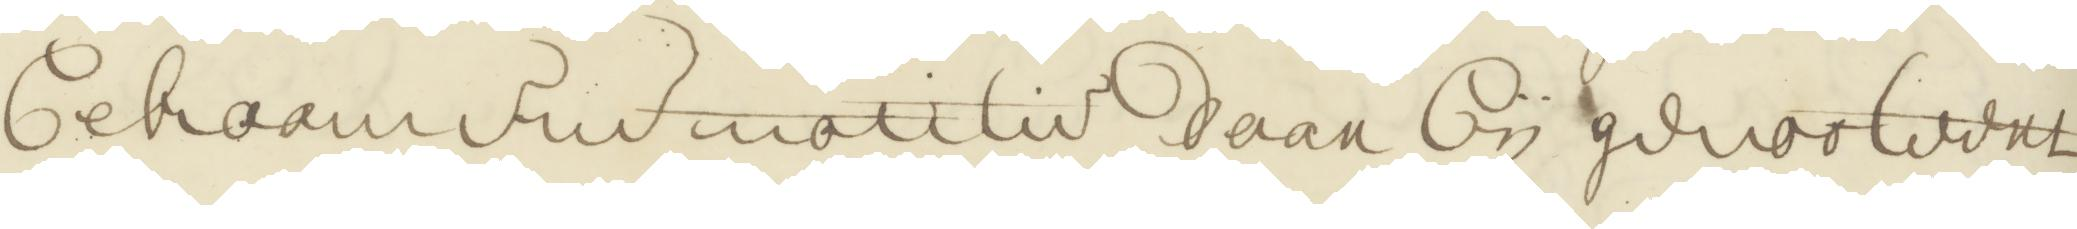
bekoomene notitie daar bij genooteert
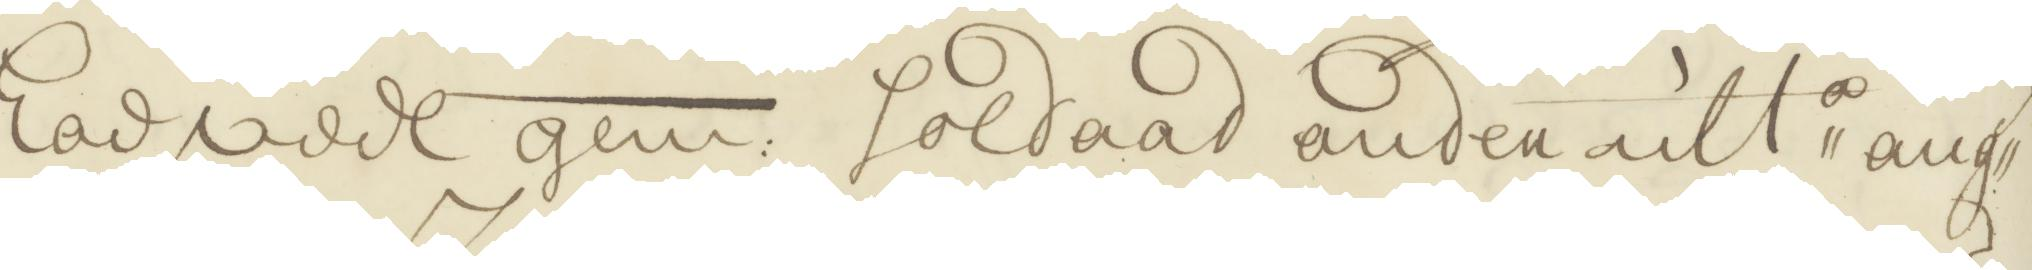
hoe veel gem: soldaad onder ult„o aug„o
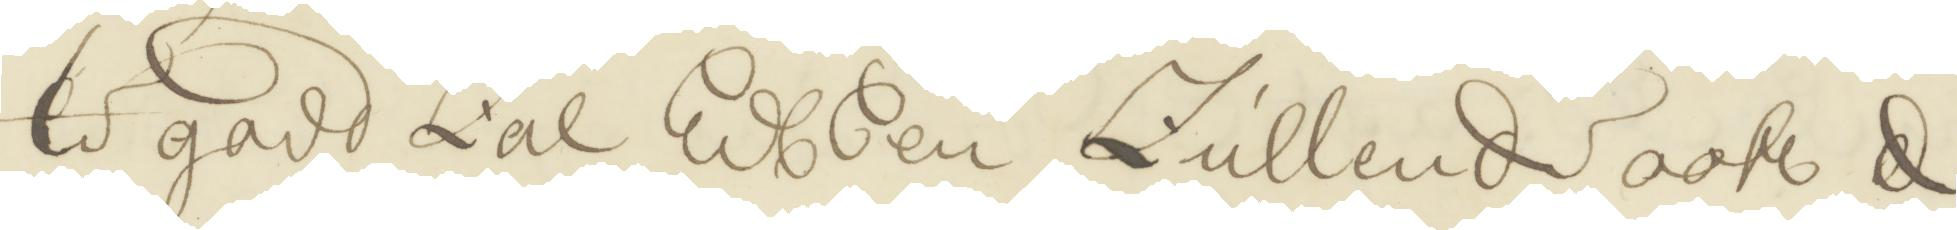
te goed Zal hebben Zullende ook de
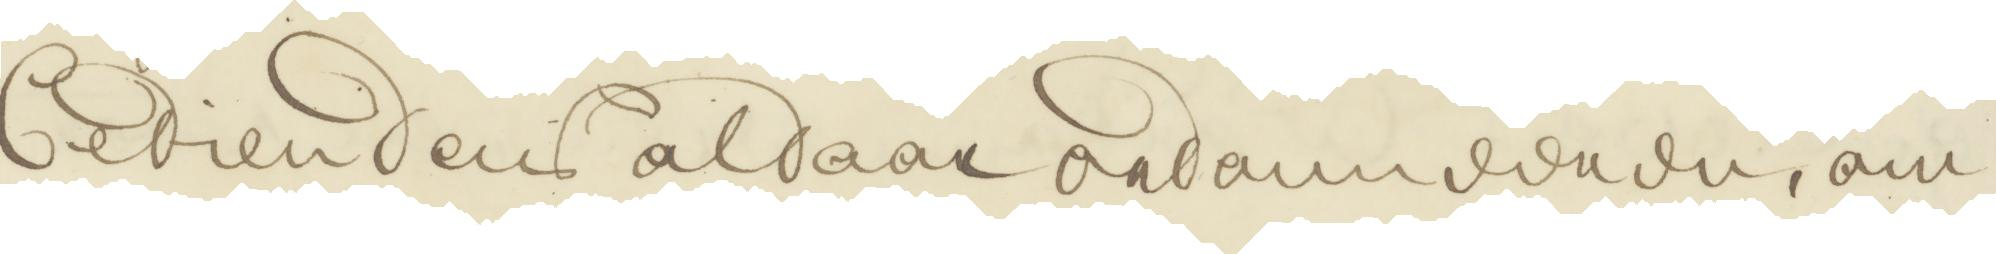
bediendens aldaar ordonneeren, om
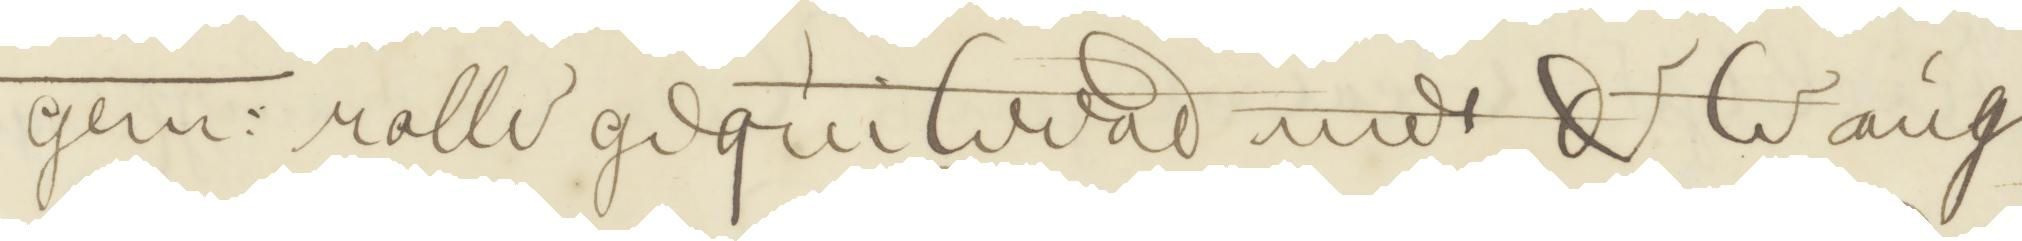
gem: rolle gequiteerd met de terug
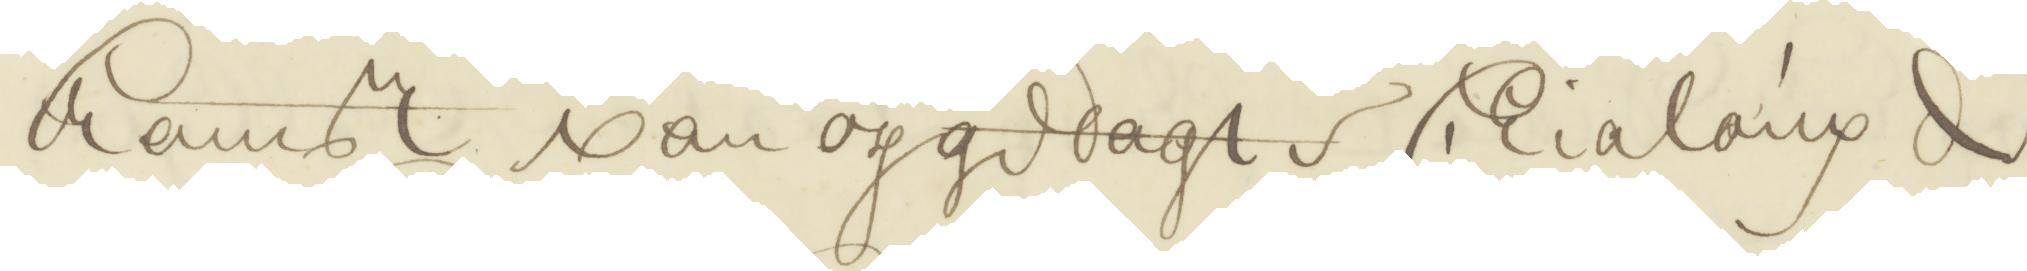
komst van opgedagte Chialoup de
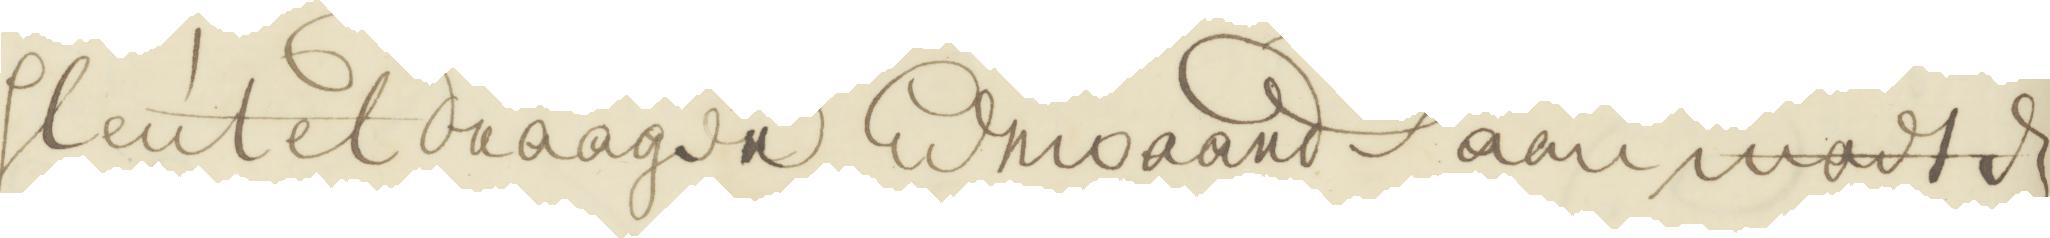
Sleuteldraager herwaards aan moeten
